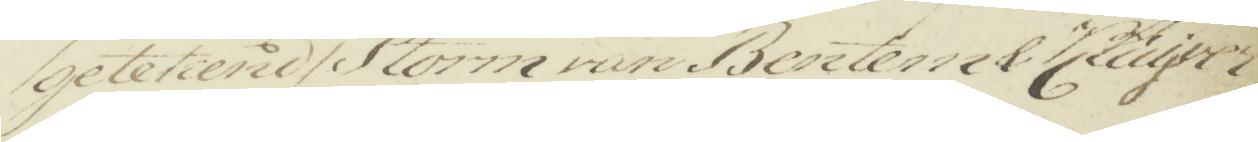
/getekend/ Storm van Bentem & Kluijver
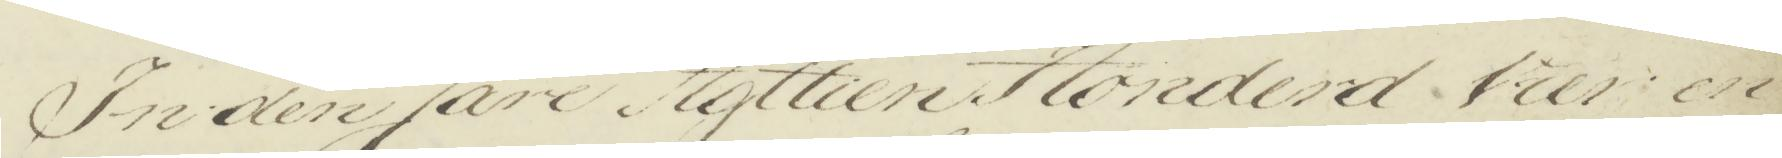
In den Jare Agttien Honderd Vier, en
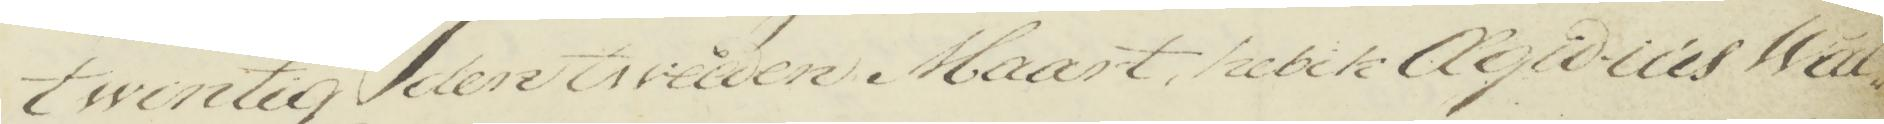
twintig den tweeden Maart heb ik AEgidius Wal„
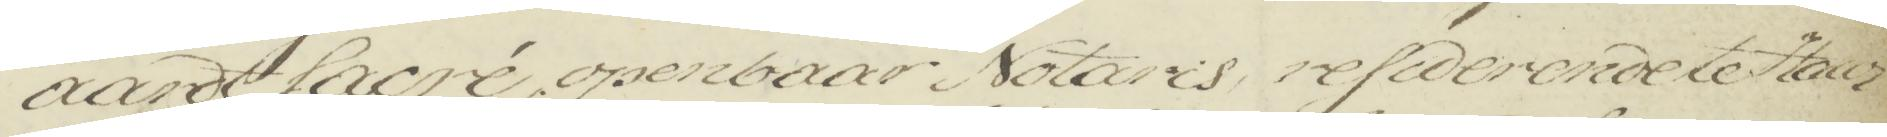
aardt Cacré, openbaar Notaris, residerende te Haar
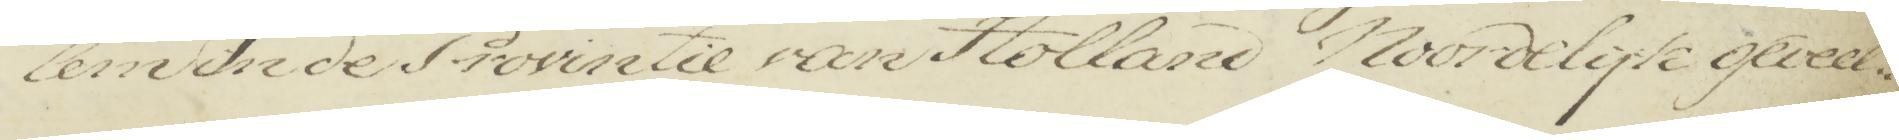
lem in de Provintie van Holland Noordelijk gedeel„
